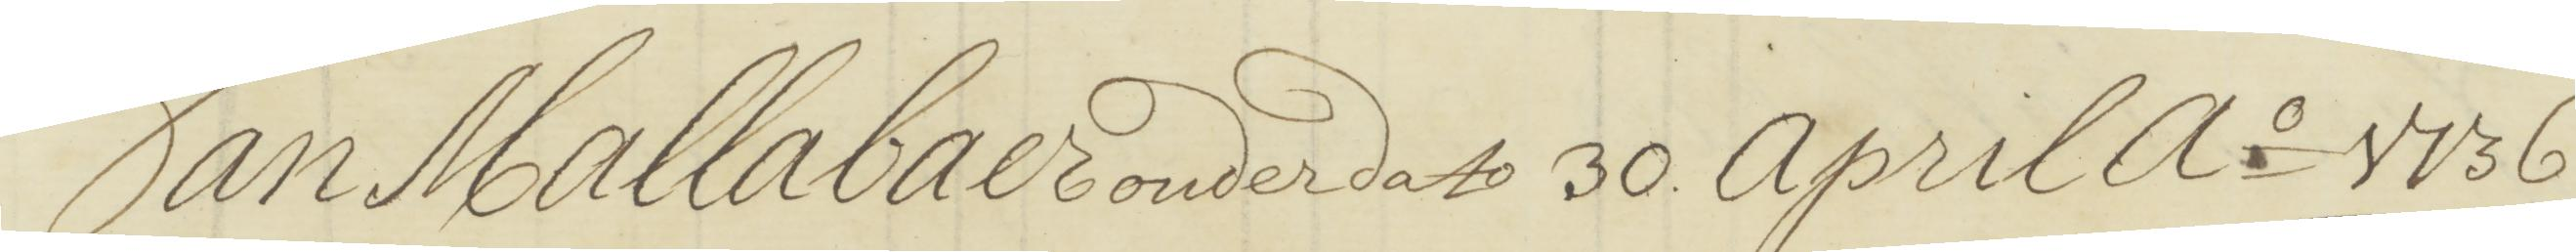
Van Mallabaer onder dato 30. April A=o 1736
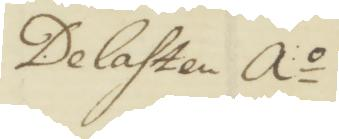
De lasten A=o
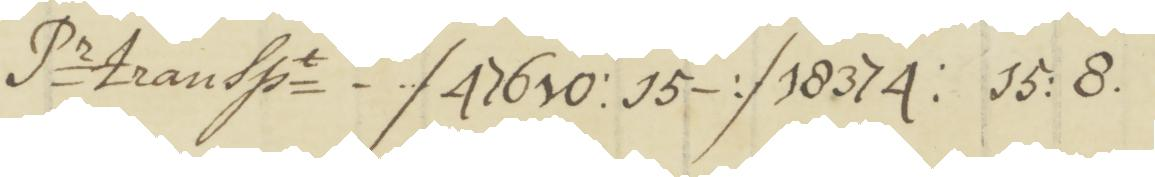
P=r transp=t ƒ 47610:15—:ƒ18374:15:8.
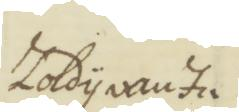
Zoldij van In„
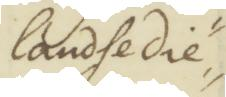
landse die„
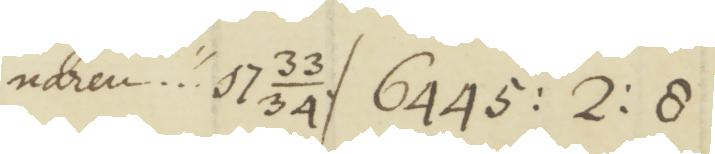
naren.... 17 33/34 ƒ 6445: 2: 8
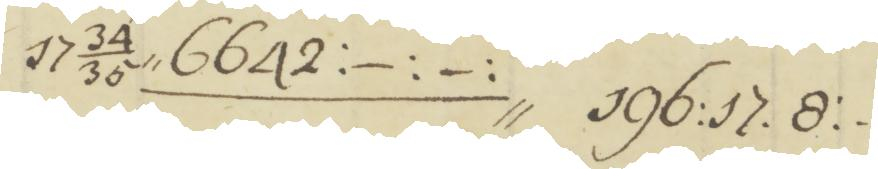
17 34/35„ 6642:—:—:„ 196:17.8:-
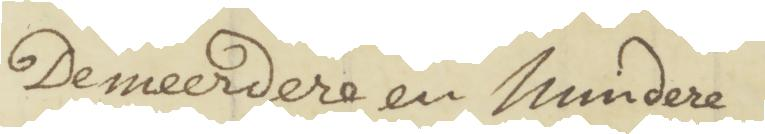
De meerdere en mindere
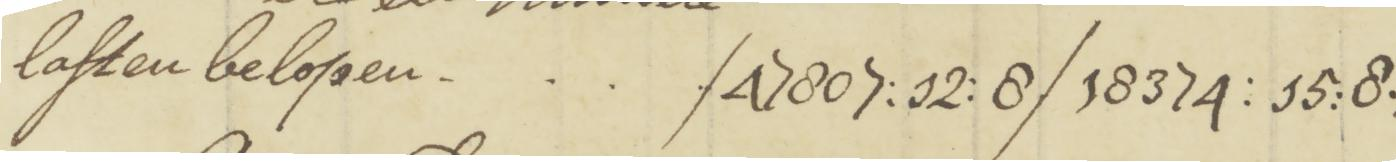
lasten belopen- . . ƒ47807:12:8 ƒ18374:15:8.
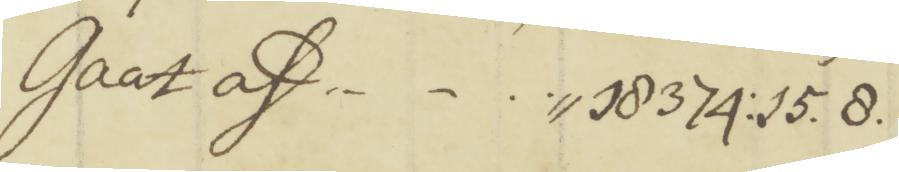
Gaat af -- - . .„18374:15.8.
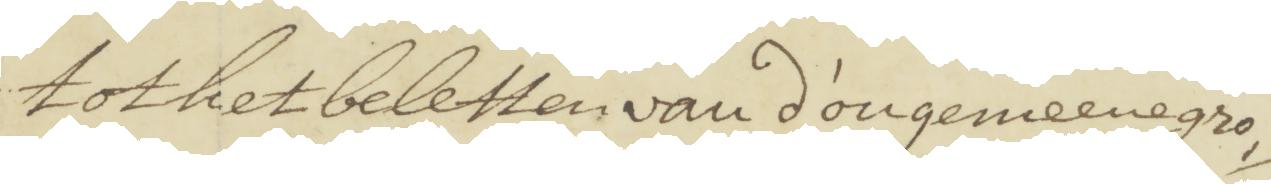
tot het beletten van d’ongemeene gro„
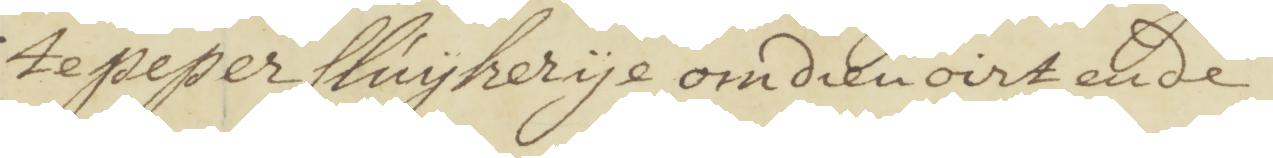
te peper sluijkerije om dien oirt ende
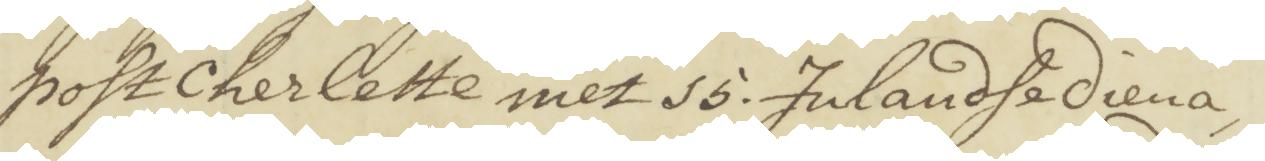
post cherlette met 15. Jnlandse diena„
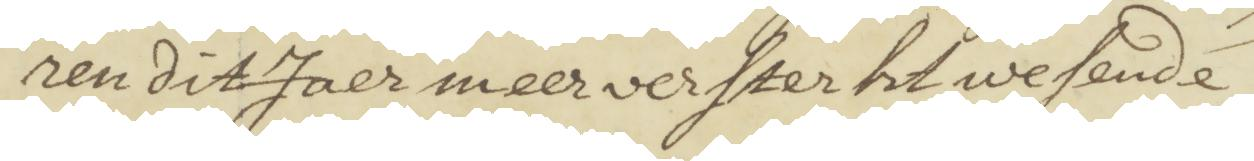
ren dit Jaer meer versterkt wesende
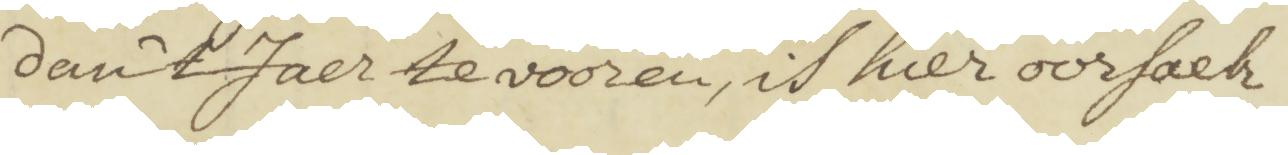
dan ’t Jaer te vooren, is hier oorsaek
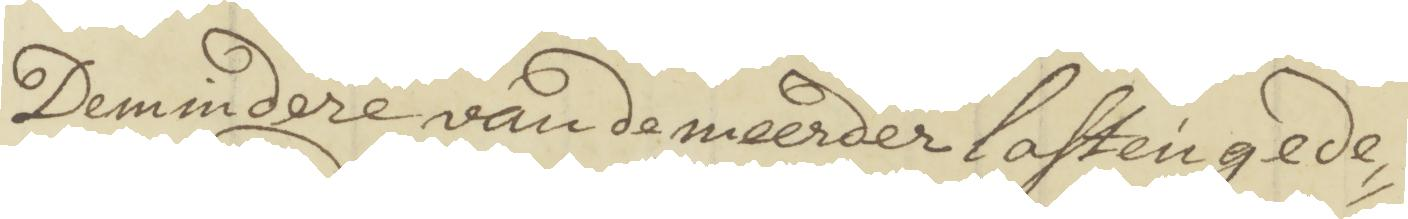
Demindere van de meerder lasten gede„
